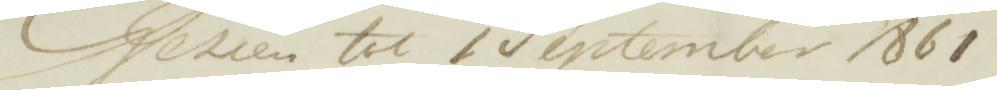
Gezien tot 1 September 1861
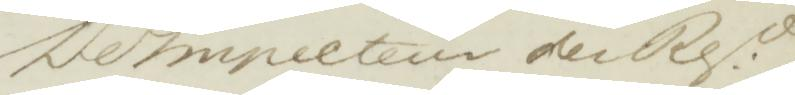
De Inspecteur der Rg:ie
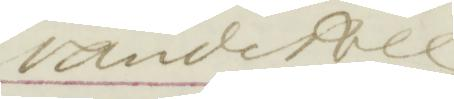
vandePoll
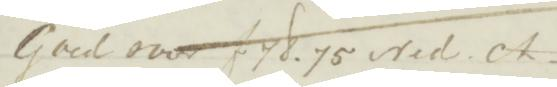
Goed voor ƒ78.75 Ned. ct.
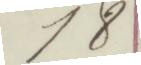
1 8
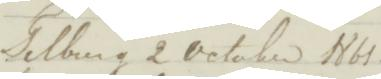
Tilburg 2 October 1861
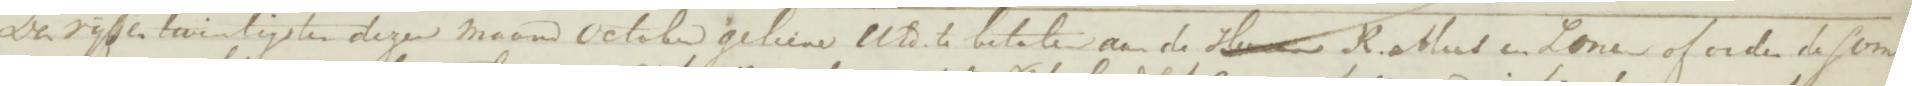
Den vijften twintigsten dezer maand October gelieve UEd: te betalen aan de Heren R. ahus en Zonen, of order de Som
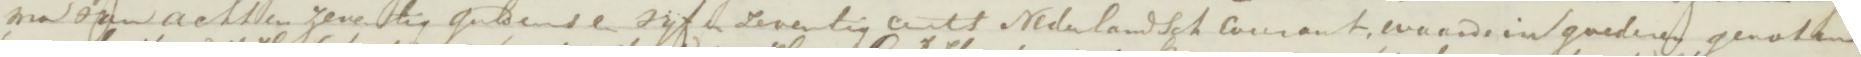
ma van acht en zeventig guldens en vijf en zeventig cents Nederlandsch Courant, waarde in goederen genoten
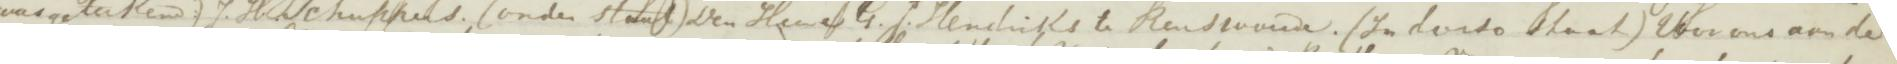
(was geteekend :) J. H. Schuppens. (onder staat Den Heer G. J: Hendriks te Renswoude. /In dorso staat) Voor ons aan de
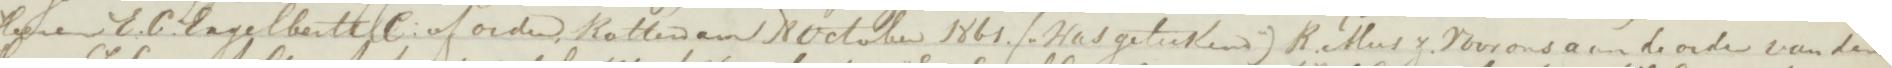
heeren E.C Engelberts & C: of order, Rotterdam 18 october 1861. (: Was geteekend ) R. Mus z. Voor ons aan de ordre van den
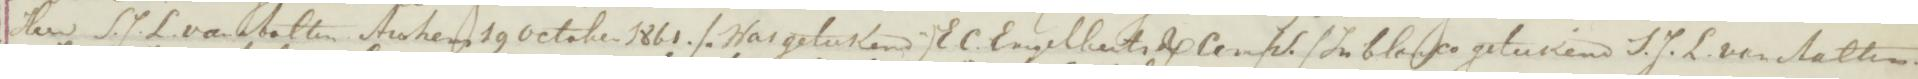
Heer S.J.L. van Aalten. Arnhem 19 October 1861. /. Was geteekend / E C. Engelberts & Comp. ) In blanco geteekend S. J. L. van Aalten.
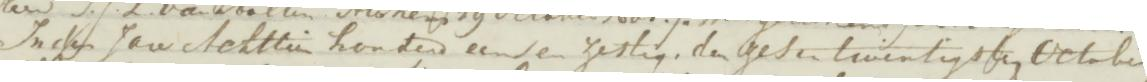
In den Jare Achttien honderd een en zestig, den zes en twintigsten Octobe
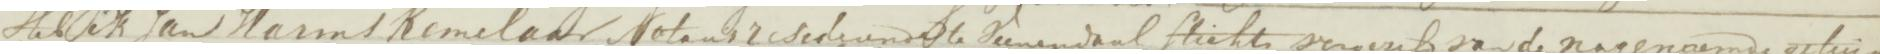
Heb ik Jan Harms Kemelaar Notaris residende te Veenendaal Stichts vergezeld van de nagenoemde getuigen
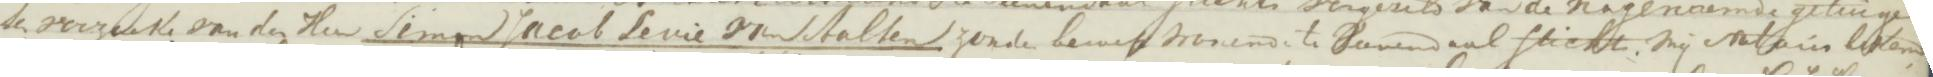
ten verzoeke van den Heer Simon Jacob Levie van Aalten zonder beroep wonende te Veenendaal Sticht, mij Notaris bekend
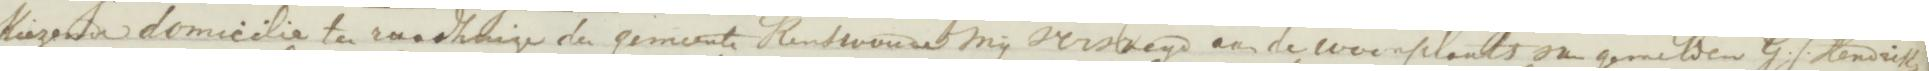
Kiezende domicilie ten raadhuize der gemeente Renswoude Mij vervoegd aan de woonplaats van gemelden G: J: Hendriks
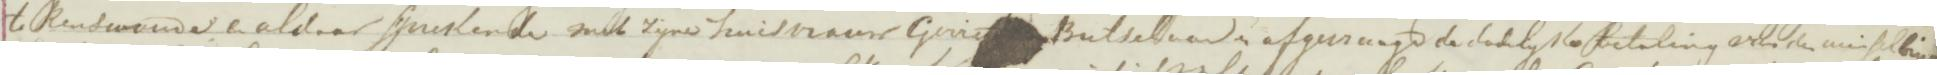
te Renswoude den aldaar Sprekende met zijne huisvrouw Gerritje van Butselaar en afgevraagd de dadelijke betaling van den wisselbrief
